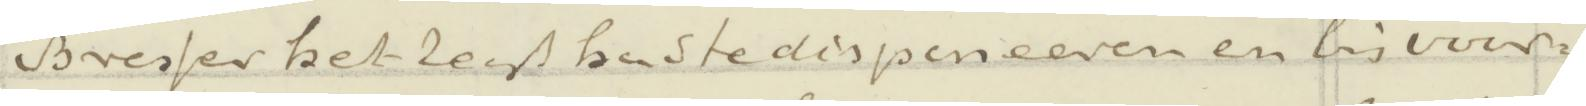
Bresser het regt had te disponeeren en bij voor=
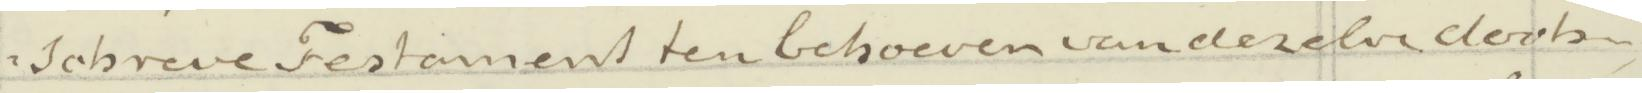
=schreve Testament ten behoeven van dezelve doch=
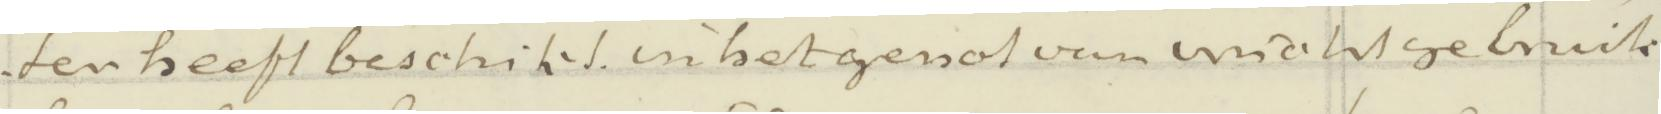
ter heeft beschikt, in het genot van vruchtgebruik
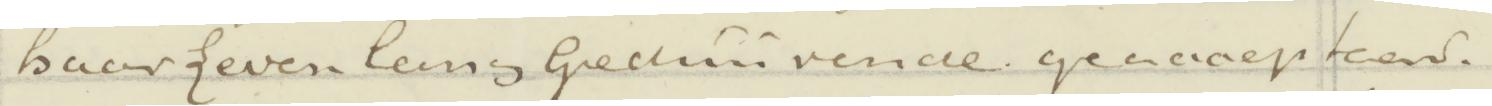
haar Leven lang Geduurende geaccepteerd.
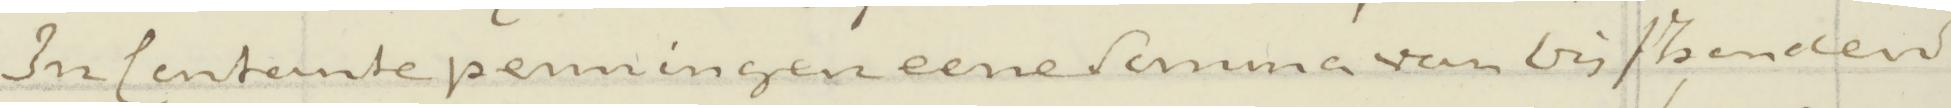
In Contante penningen eene somma van vijfhonderd
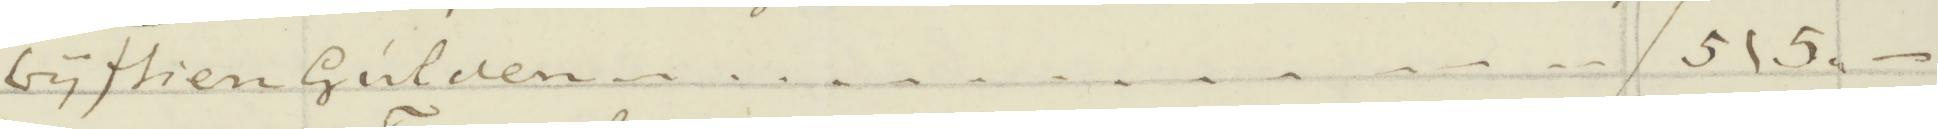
vijftien Gulden - - . . - - - - - - - - - - - ƒ 515„ —
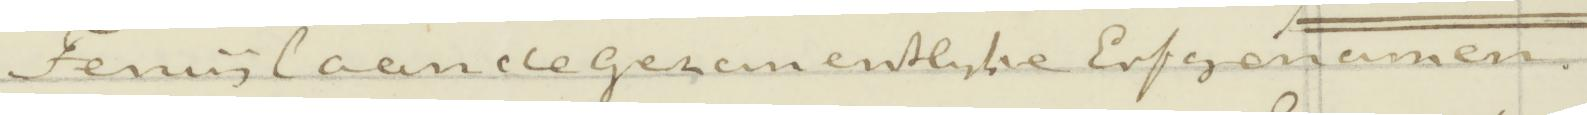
Terwijl aan de gezamentlyke Erfgenamen
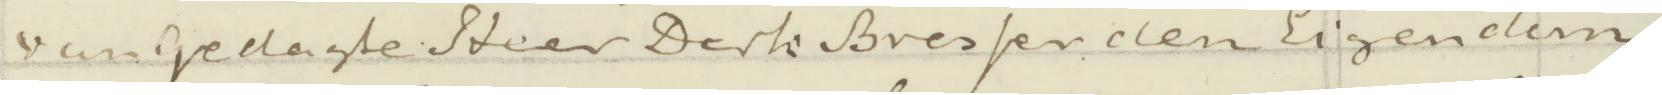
van Gedagte Heer Dirk Bresser den Eigendom
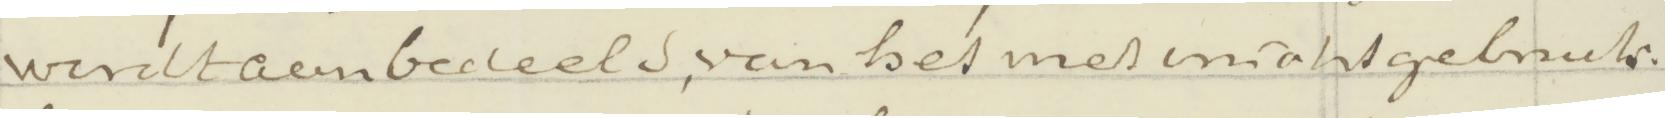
wordt aanbedeeld van het met vruchtgebruik
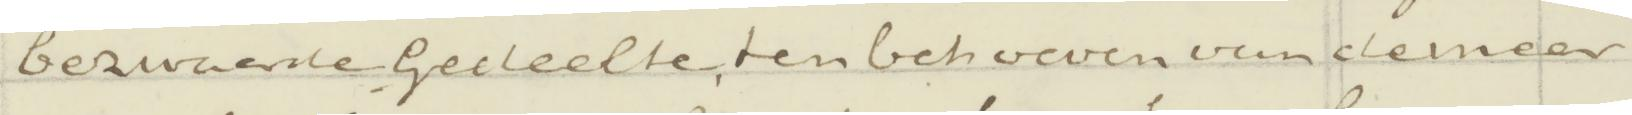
bezwaarde Gedeelte, ten behoeven van de meer
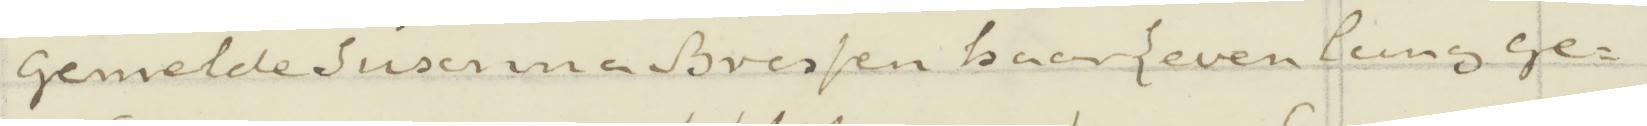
Gemelde Susanna Bressen haar Leven lang ge=
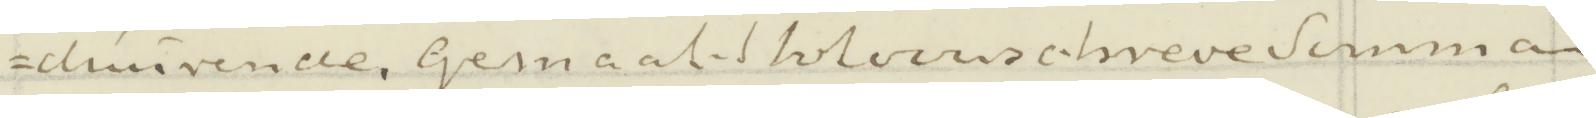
=duurende, Gemaakt tot voorschreve Somma
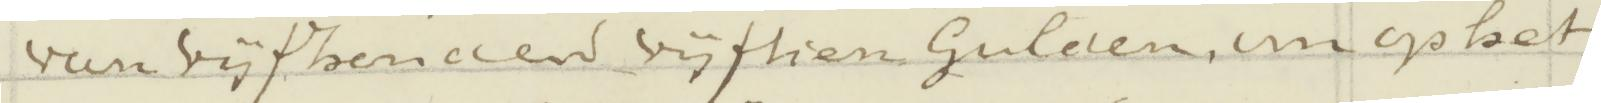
van vijfhonderd vijftien Gulden, om op het
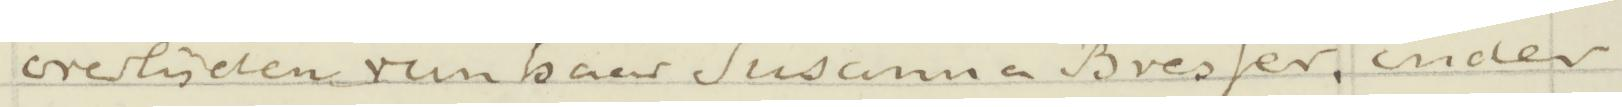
overlijden van haar Susanna Bresser, onder
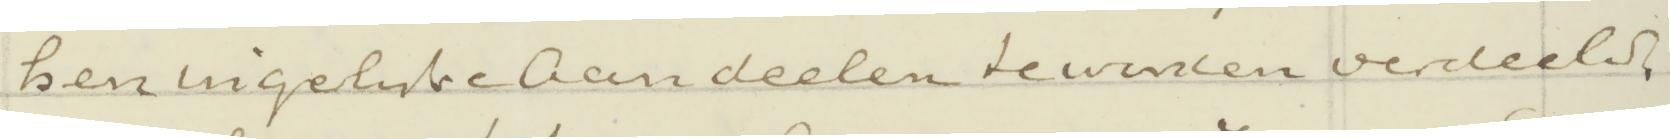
hen in gelyke aandeelen te worden verdeeld
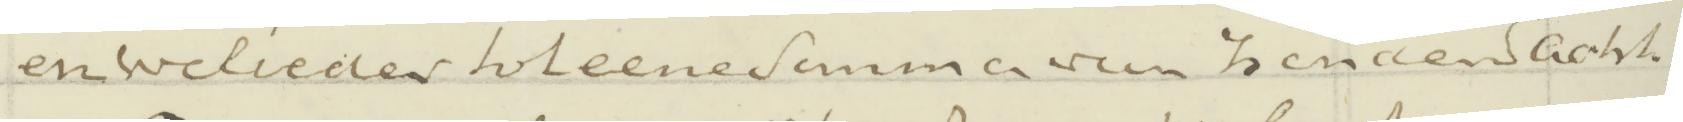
en welieder tot eene somma van honderd acht
